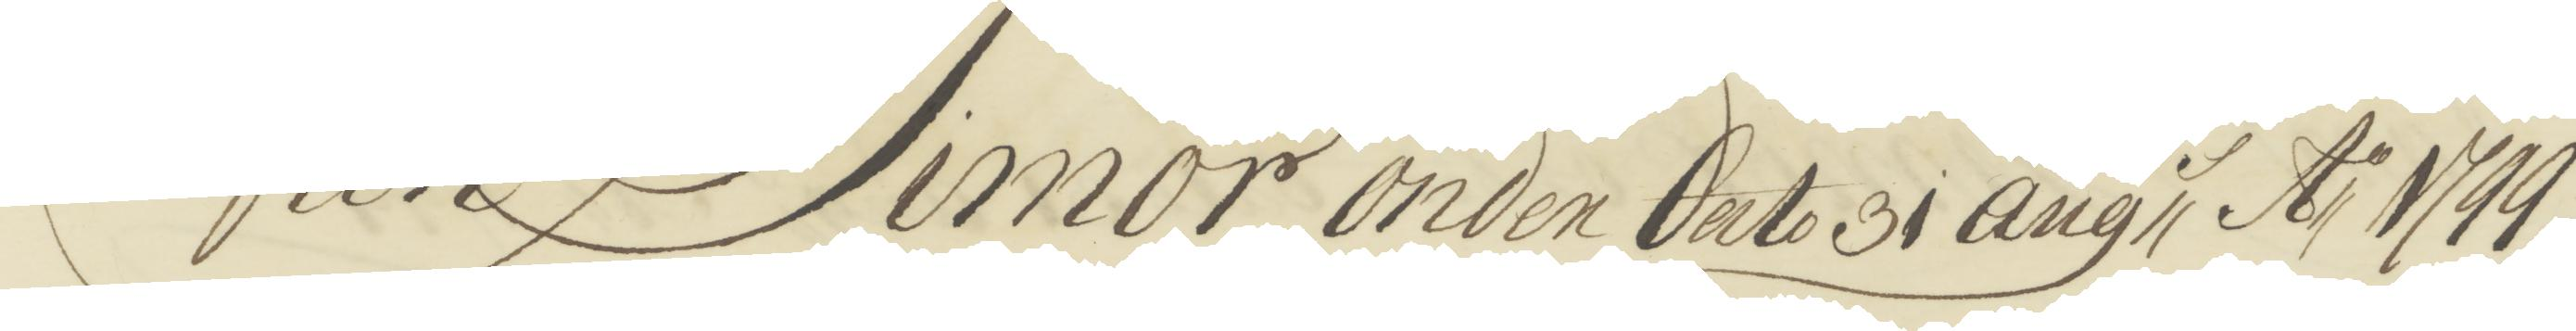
Van Timor onder dato 31 aug„s A„o 1744
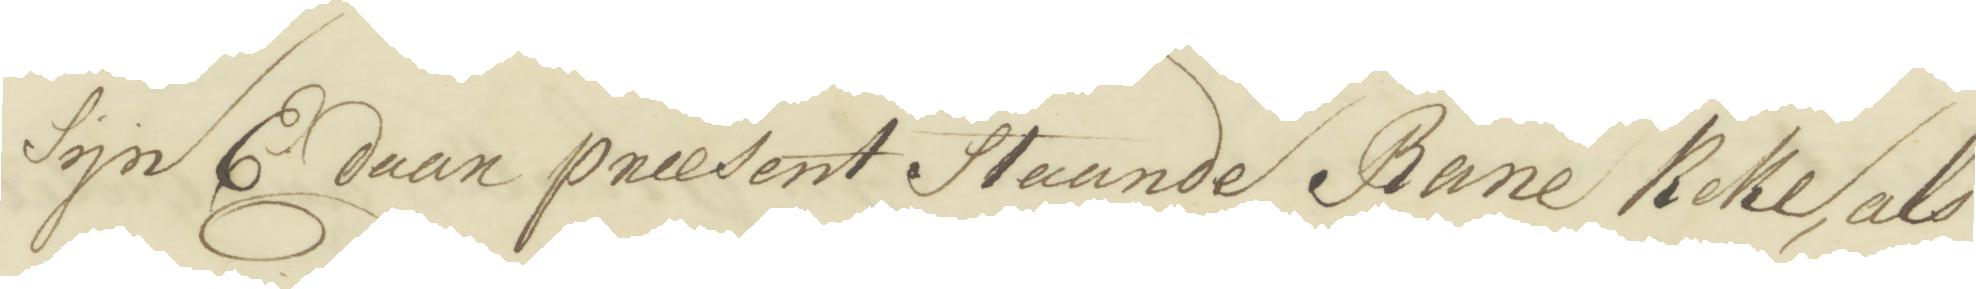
sijn E daar praesent staande Rane Keke, als
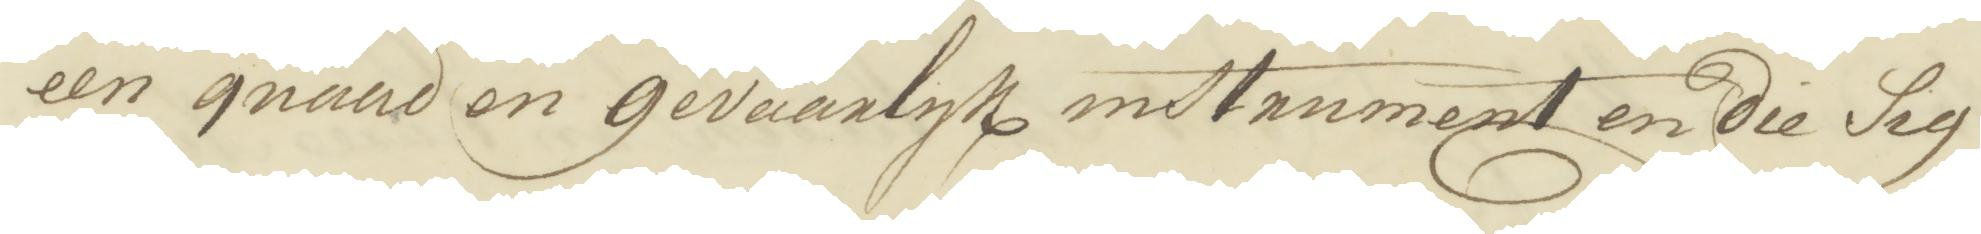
een quaad en gevaarlyk instrument en die sig
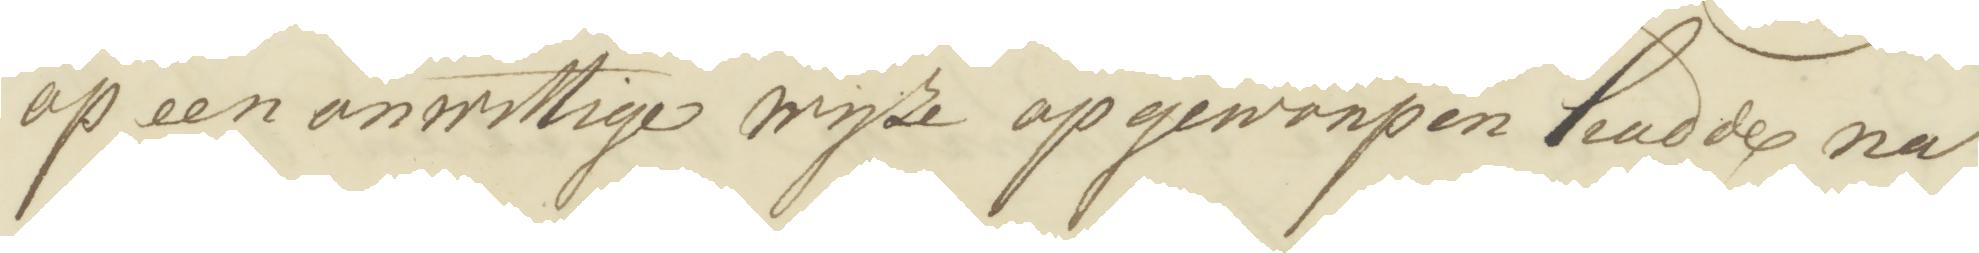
op een onwettige wijze op geworpen hadde na
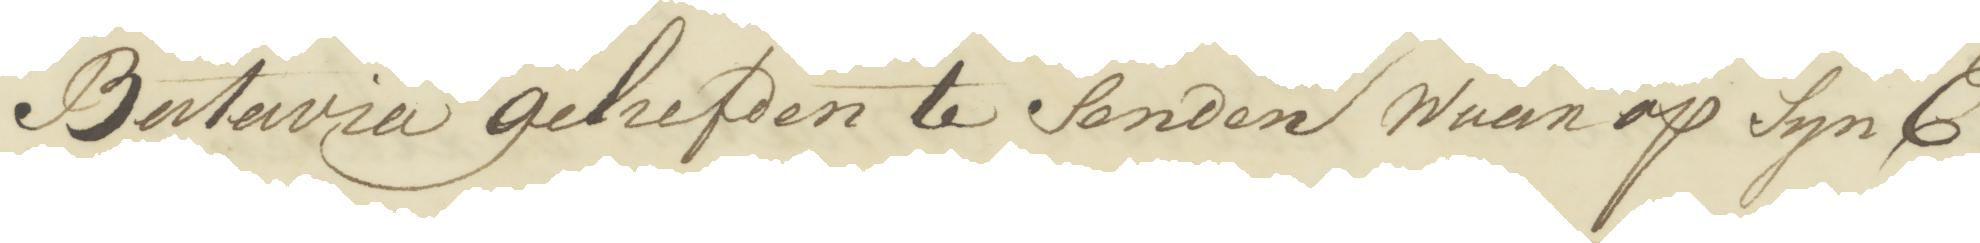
Batavia geliefden te senden waar op syn E
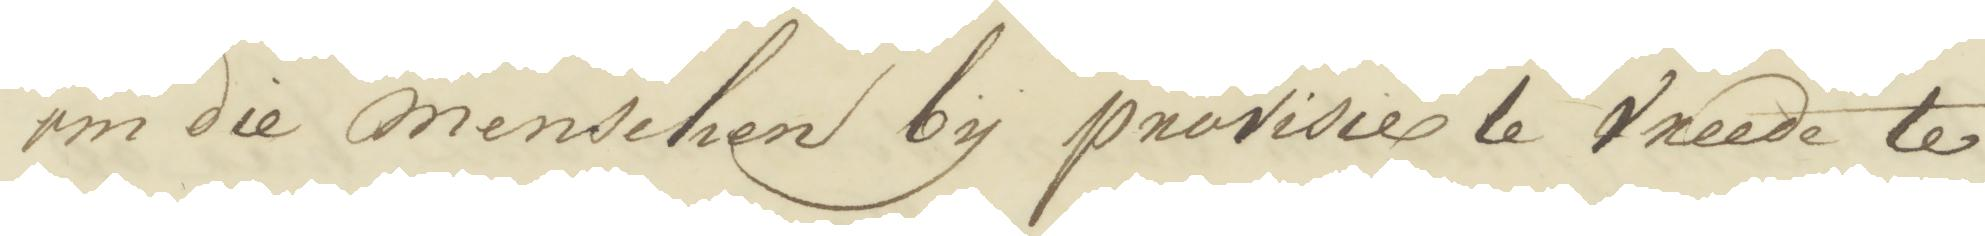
om die menschen bij provisie te vreede te
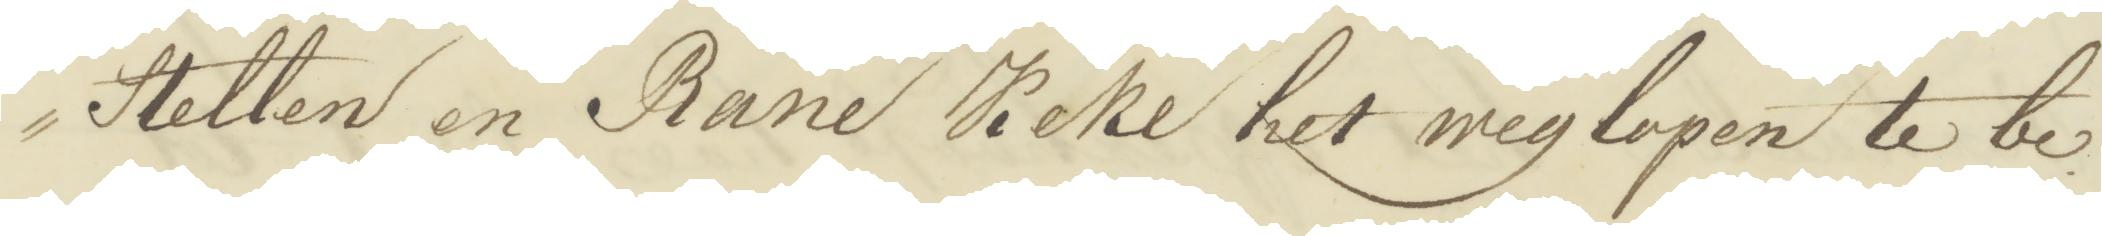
„stellen en Rane Keke het weglopen te be
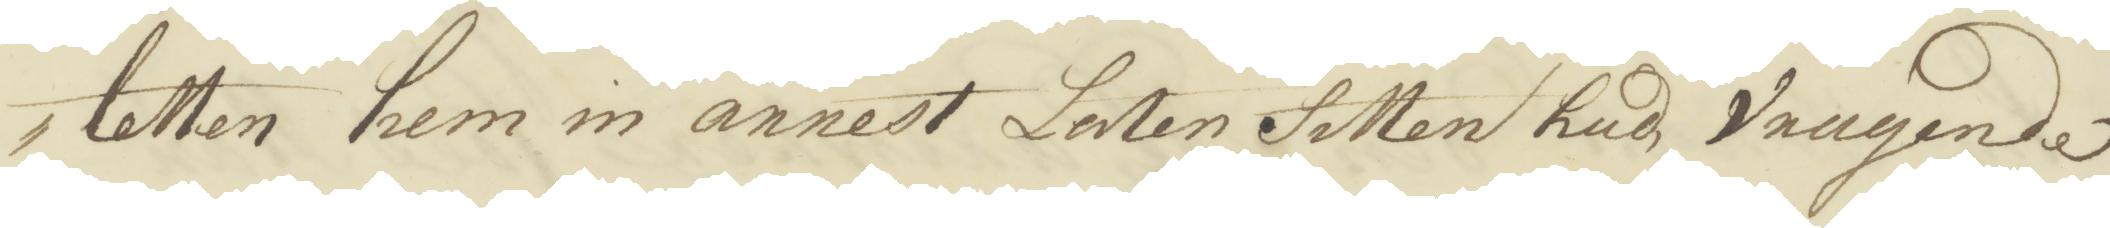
„letten hem in arrest laten sitten had, vragende
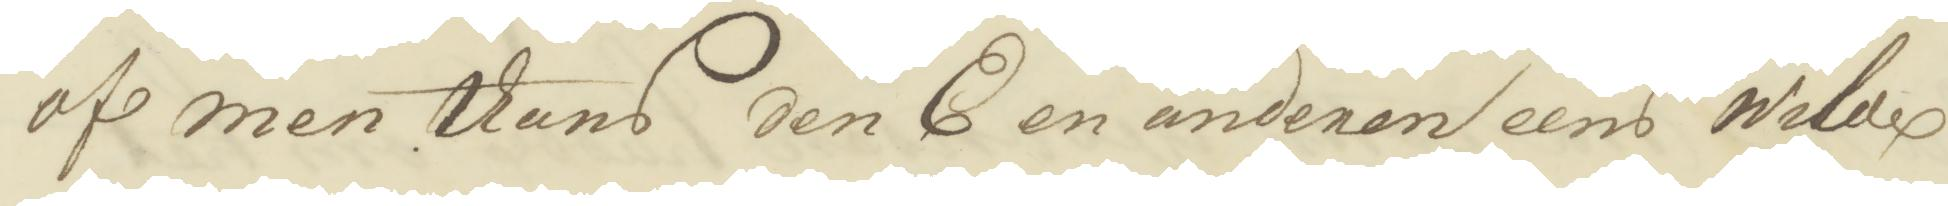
of men thans den E en anderen eens wilde
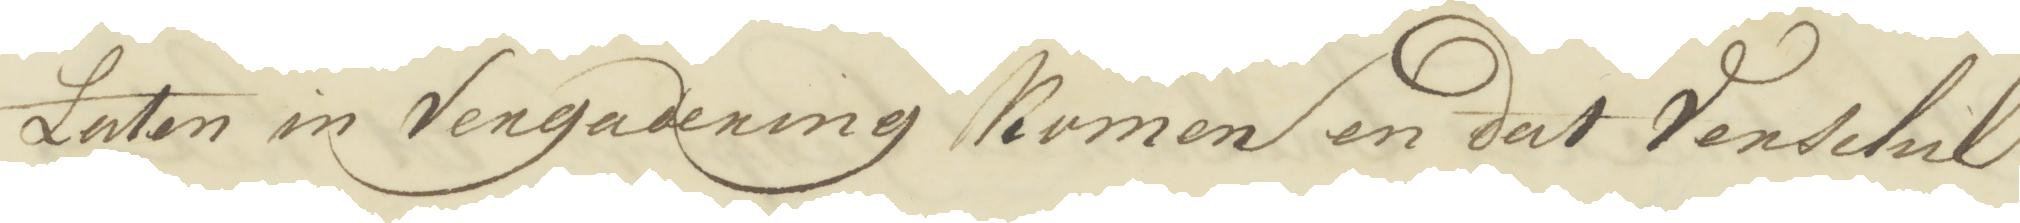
laten in vergadering komen en dat verschil
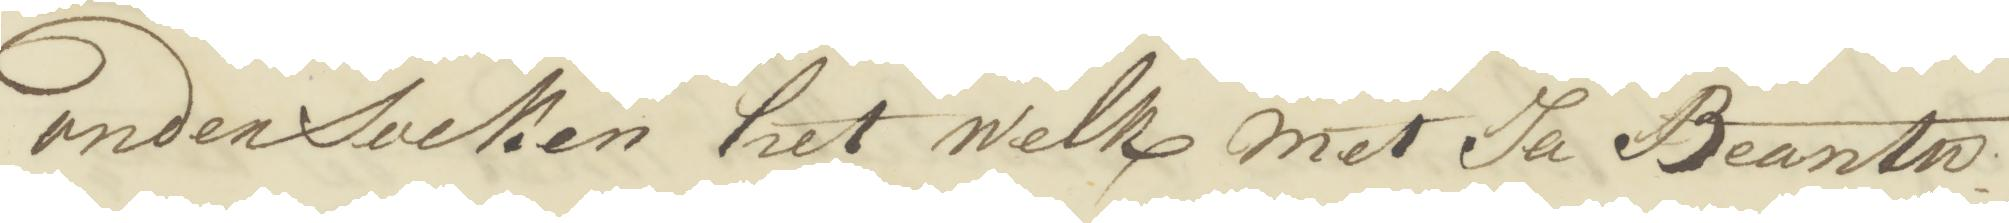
ondersoeken het welk met Ja Beantw:
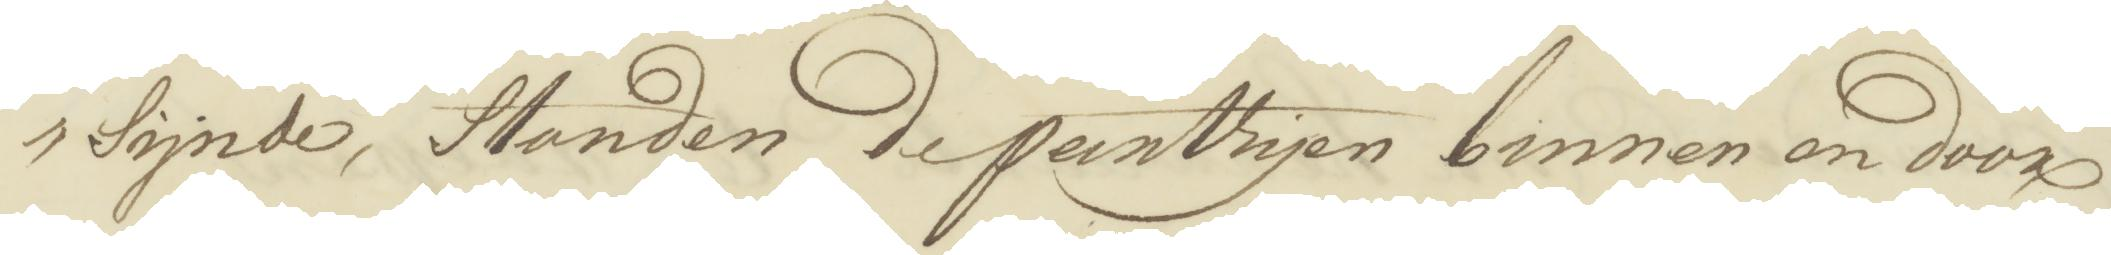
„sijnde, stonden de parthijen binnen en door
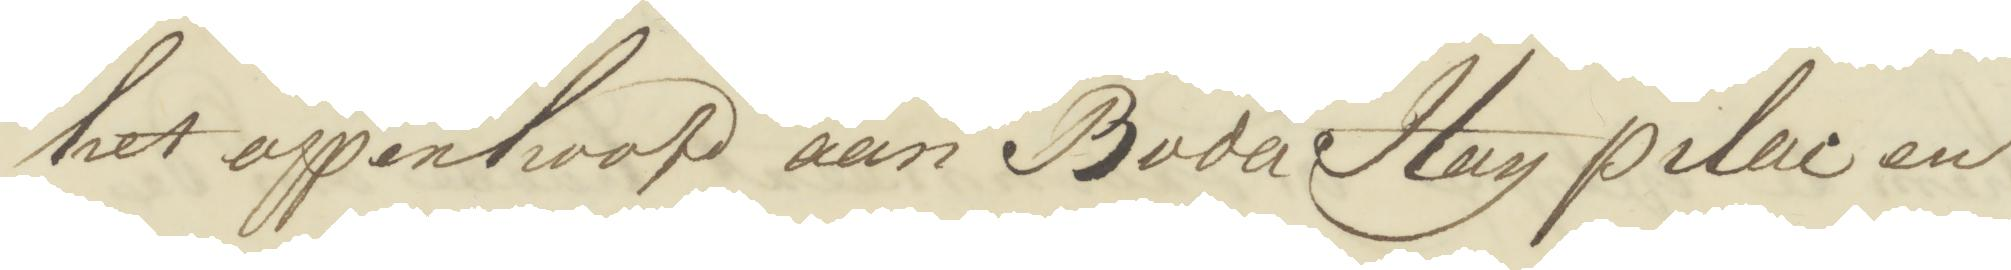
het opperhoofd aan Boda Haij pilac en
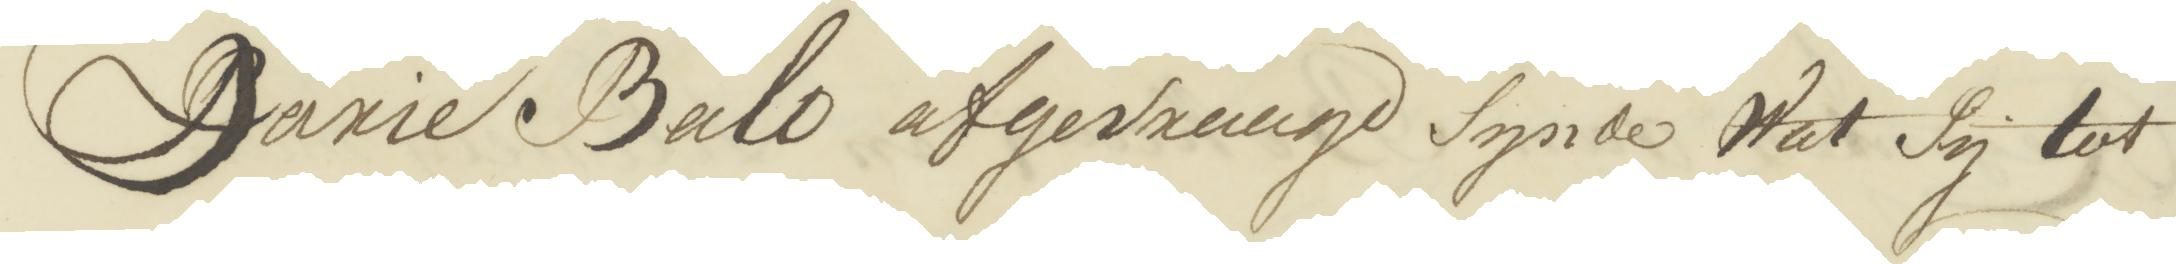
Darie Balo afgevraagd sijnde wat sij tot
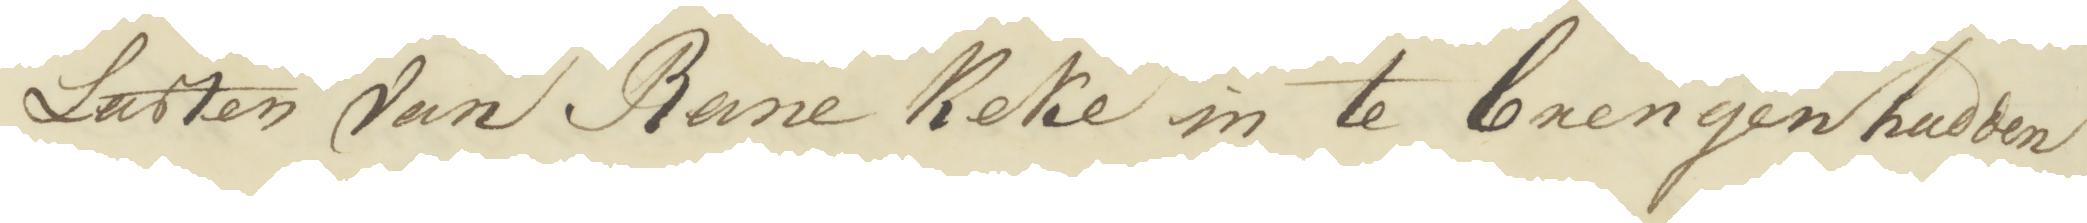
lasten van Rane Keke in te brengen hadden
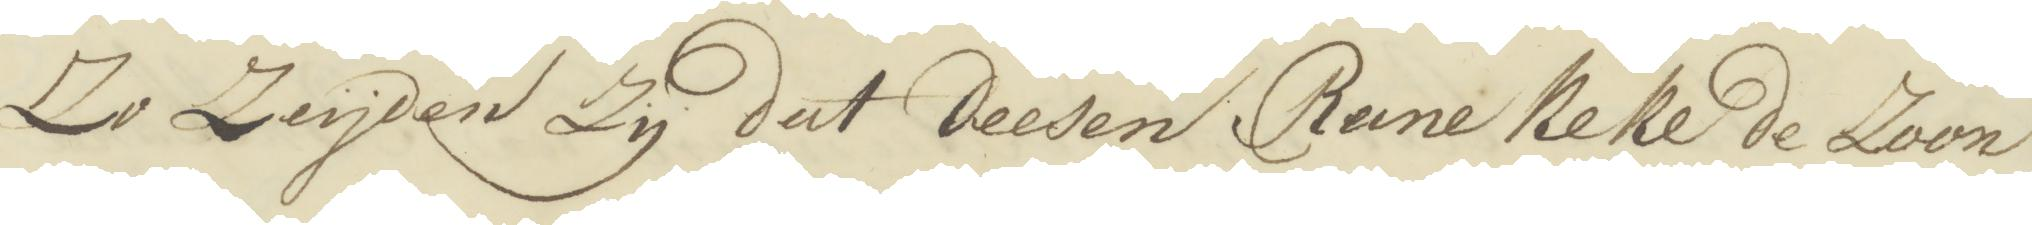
zo zeijden zij dat deesen Rane Keke de zoon
